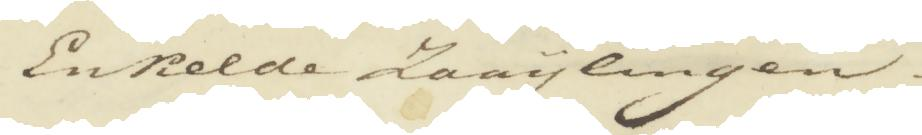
Enkelde Zaaijlingen
